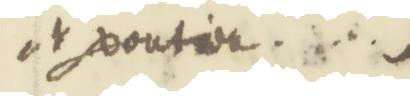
1 portier . . .
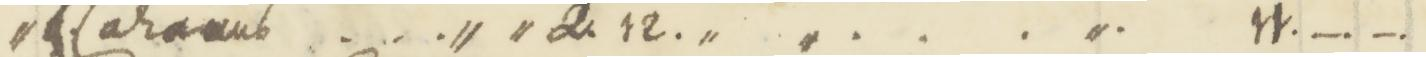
„ 1. Cahaars . . . „ „ 2. 12. „ „ . . . „ . 11
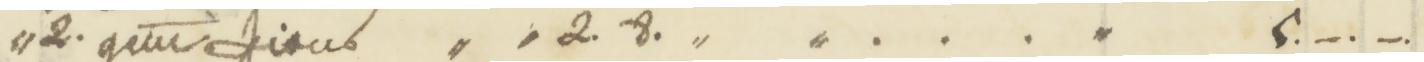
„2. gem pions „ „ 2. 8. „ „ . . . „ 5.–.–.
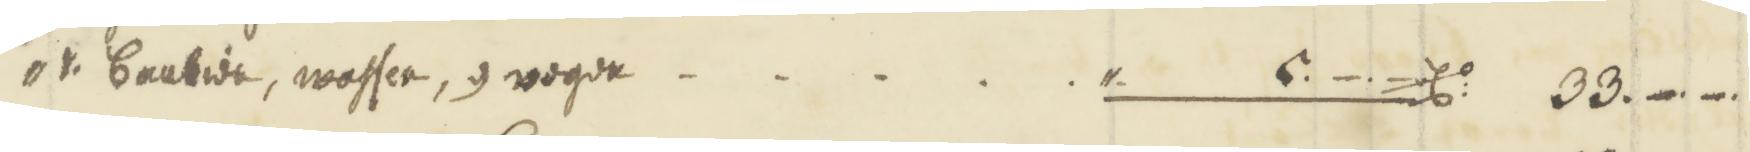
1. barbier, wasser, en veger - - - . . „ 5.–.–. r:o 33.–.–.
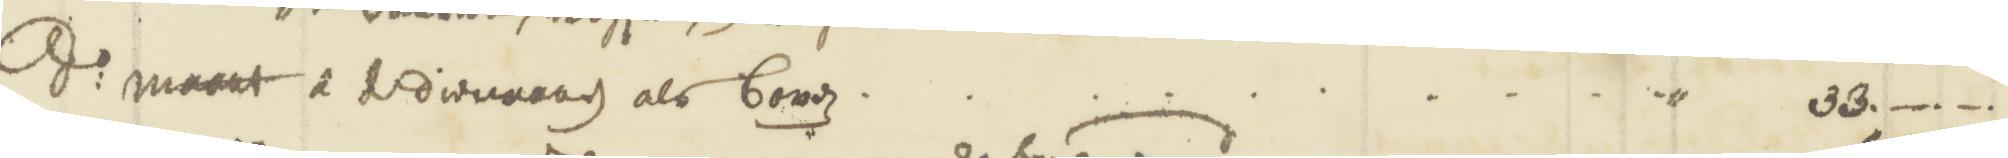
d:o maart â 8 dienaaren als boven . . . . . . . . . . „ 33.–.–.
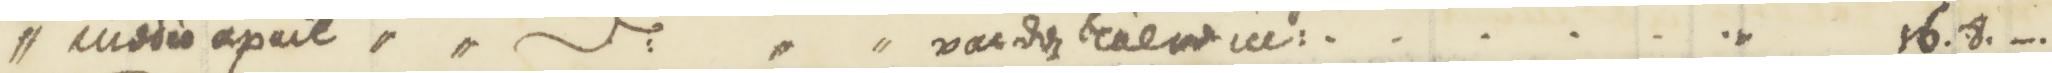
„ medio april „ „ _:o „ „ van den halve m:d . . . . . . „ 16. 8.–.
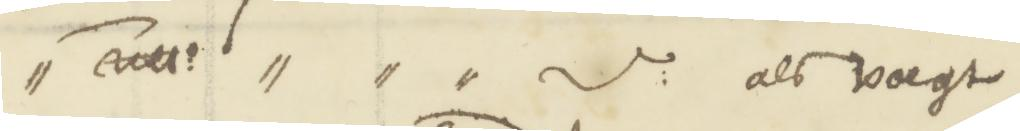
„ ult: „ „ „ _:o als volgt
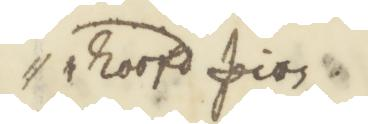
„ 1 hoofd pion .
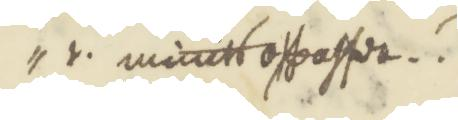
„ 1. munts oppasser . .
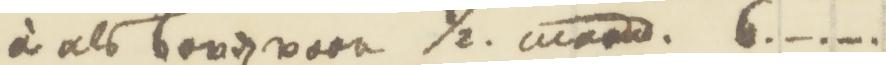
à als boven voor ½. maad. 6.–.–.
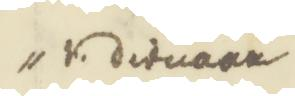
„ 1. dienaar
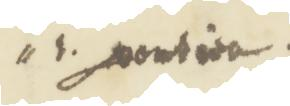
„ 1. portier
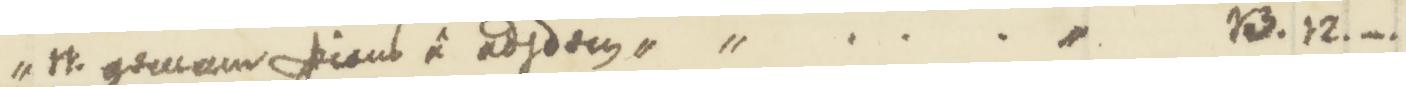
„ 11. gemam pions â adjdem „ „ . . . „ 13.12.–.
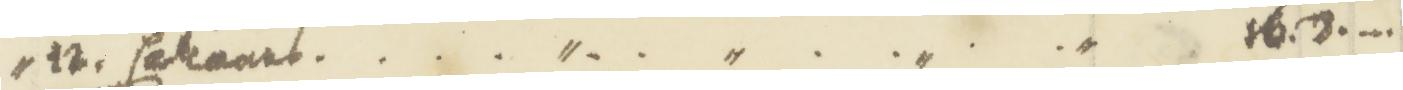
„ 12. Cahaars . . . . „ . . „ . . „ . . „ 16. 8.–.
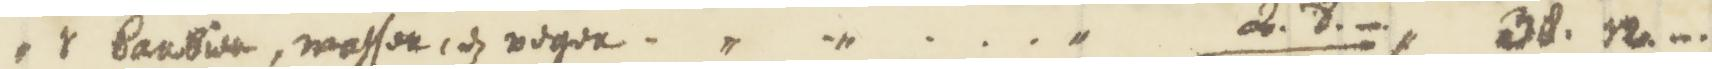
„ 1 barbier, wasser, en veger - „ - „ . . . „ 2. 8.–. „ 38. 12.–.
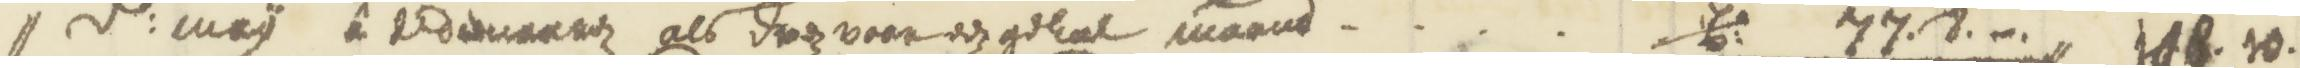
„ d:o maij â 8 dienaaren als dren voor een geheel maand . . . . r:o 77.8.–. „ 198.10.
